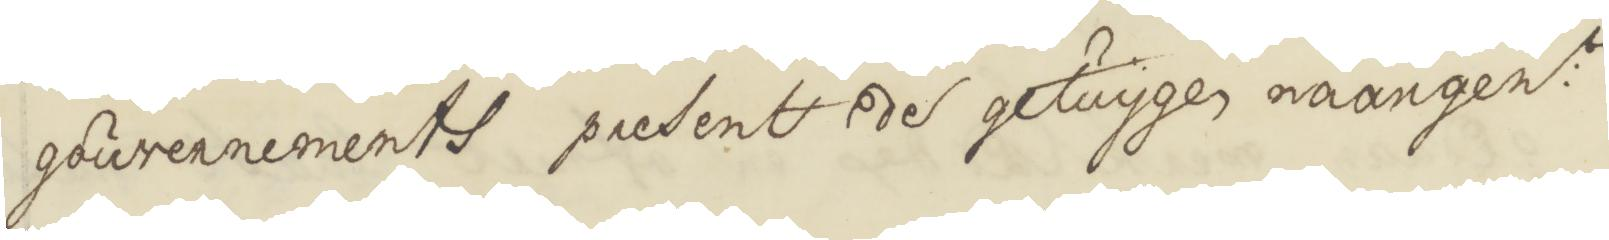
gouvernements present de getuijgen naargen:t
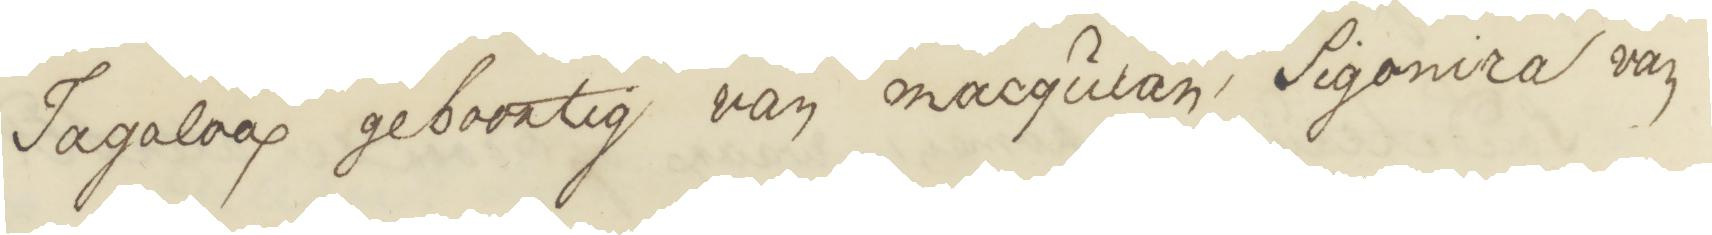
Tagoloa geboortig van macquian, Sigonira van
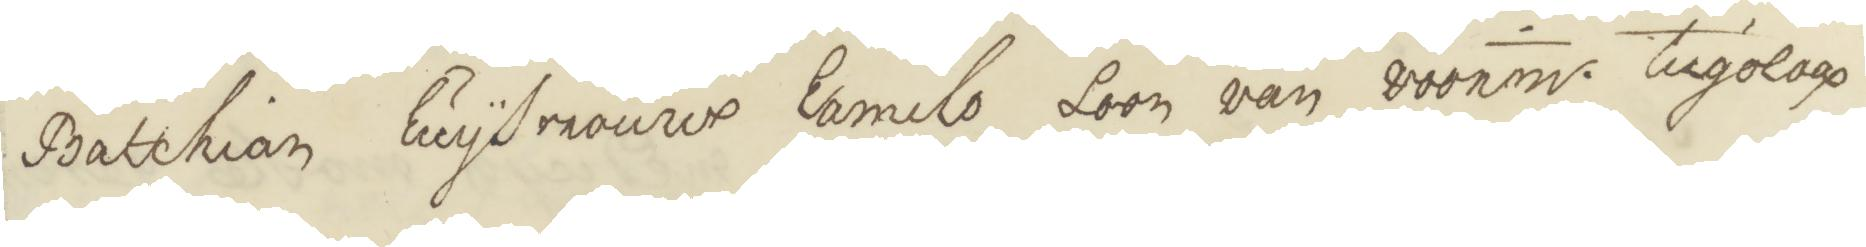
Batchian huijsvrouw hamilo soon van voorm. tugoloa
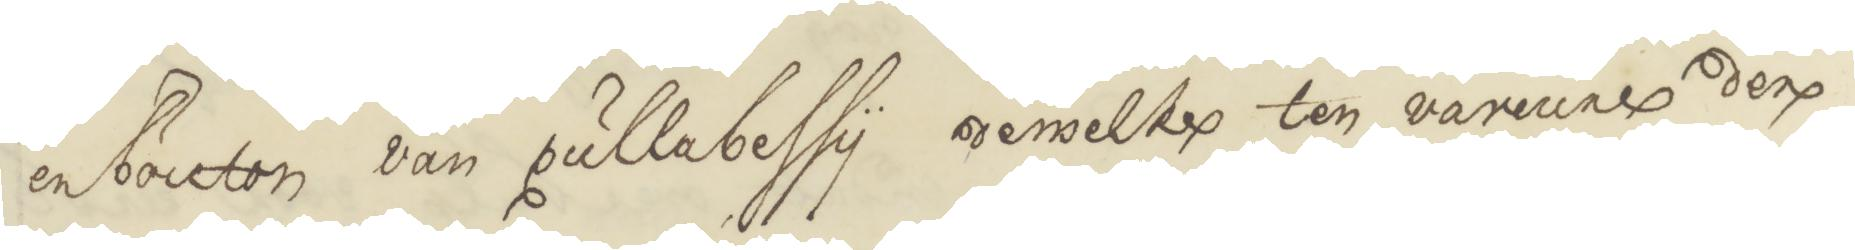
en bouton van pullabessij dewelke ten vaveure der
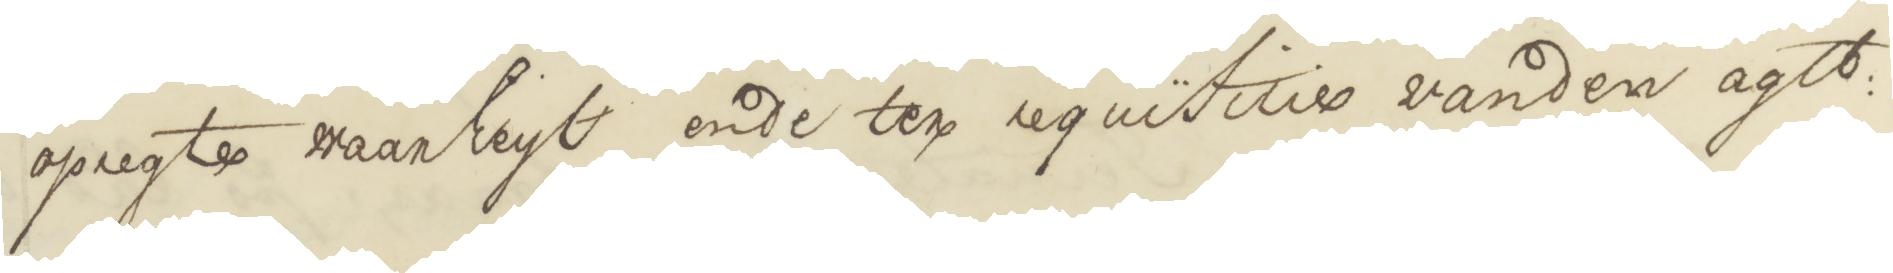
opregte waarheijt ende ter requisitie vanden agtb:
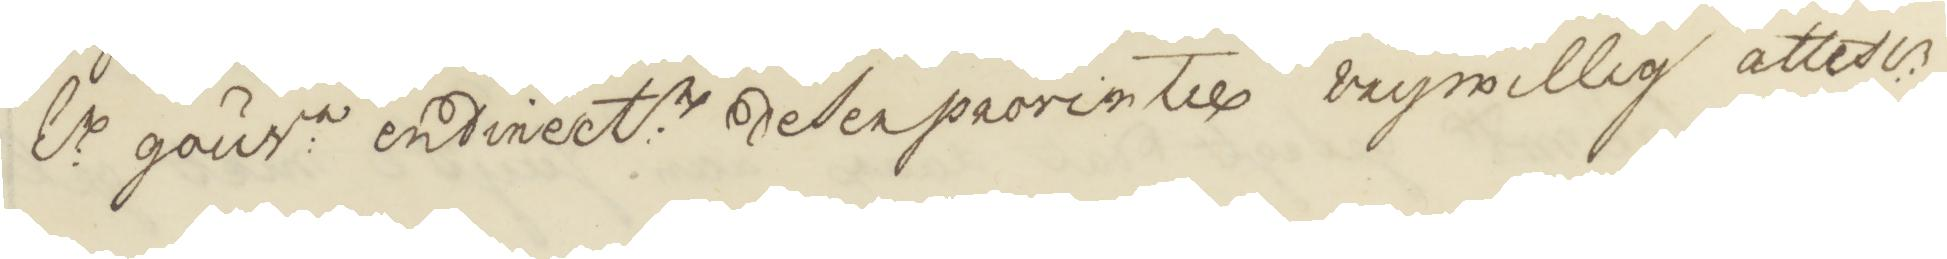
h:r gouv:r en direct:r deser provintie vrijwillig attest:n
